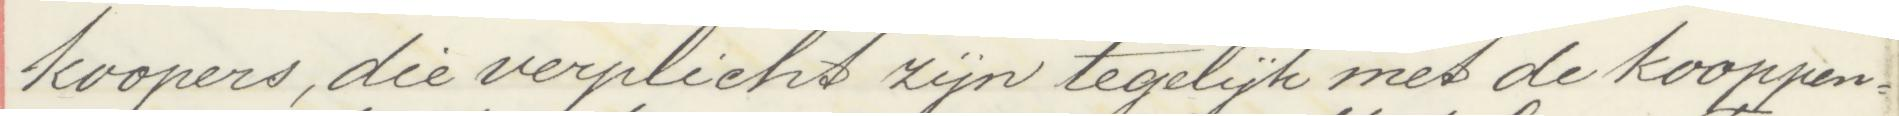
koopers, die verplicht zijn tegelijk met de kooppen=
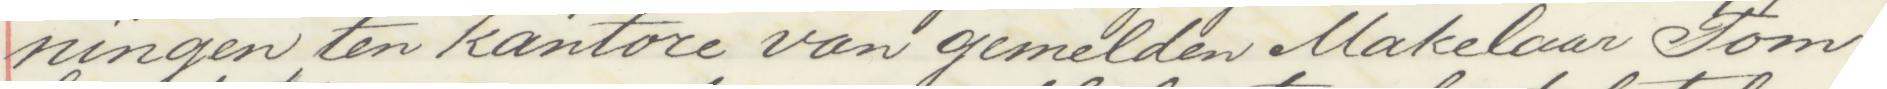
ningen ten kantore van gemelden Makelaar Tom=
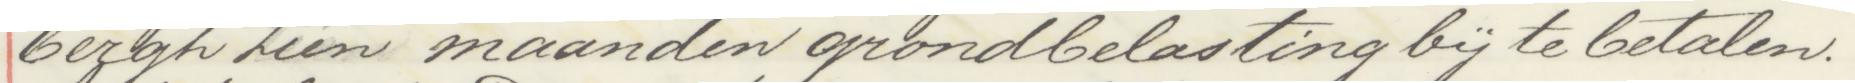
bergh tien maanden grondbelasting bij te betalen.
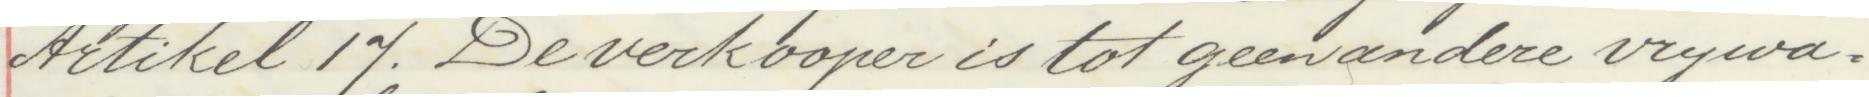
Artikel 17. De verkooper is tot geen andere vrywa„
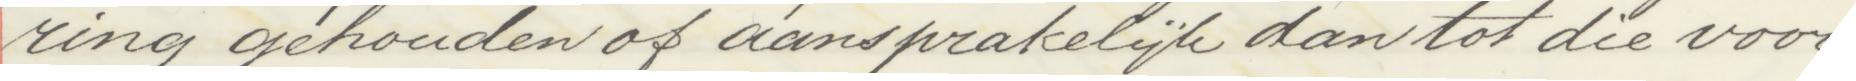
ring gehouden of aansprakelijk dan tot die voor
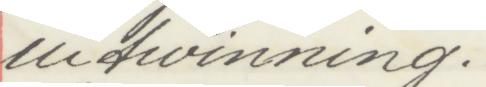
uitwinning.
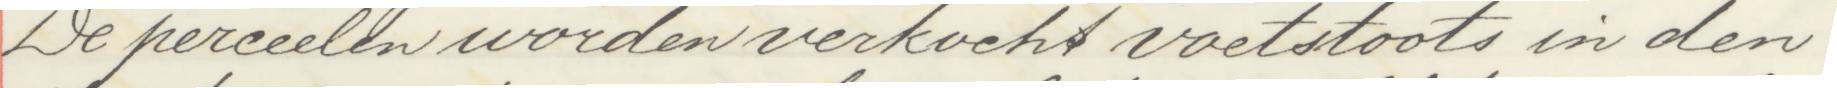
De perceelen worden verkocht voetstoots in den
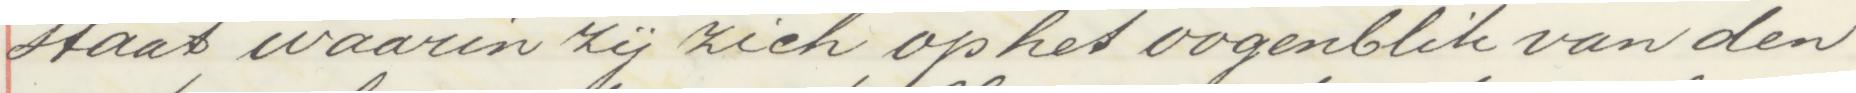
staat waarin zij zich op het oogenblik van den
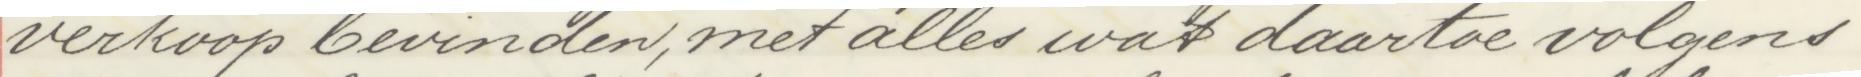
verkoop bevinden, met alles wat daartoe volgens
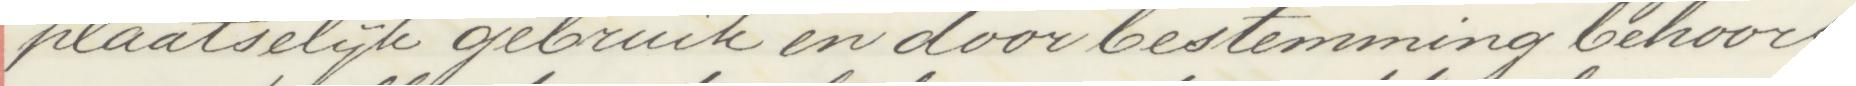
plaatselijk gebruik en door bestemming behoort
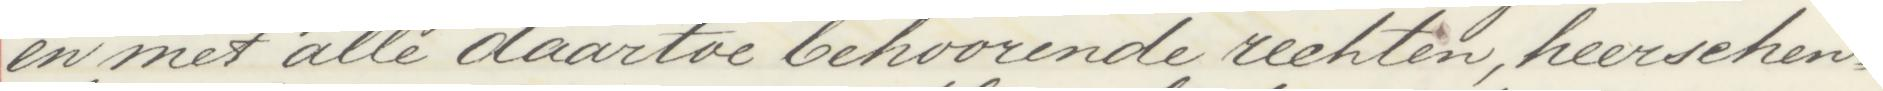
en met alle daartoe behoorende rechten, heerschen„
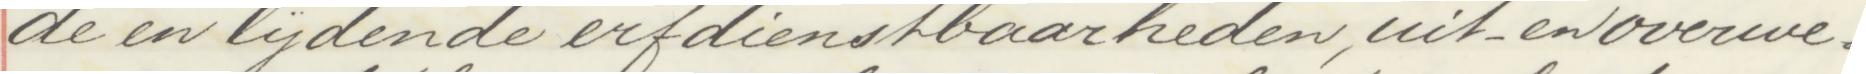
de en lijdende erfdienstbaarheden, uit- en overwe„
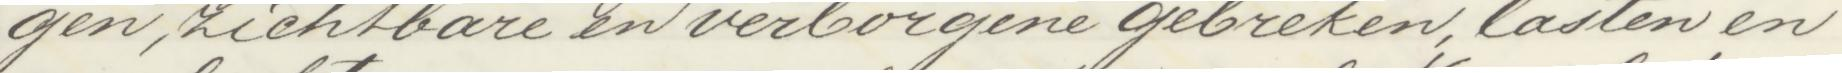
gen, zichtbare en verborgene gebreken, lasten en
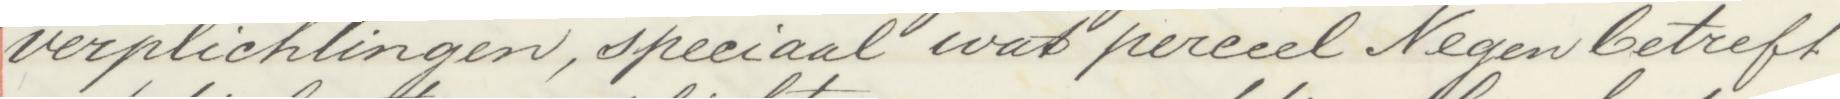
verplichtingen, speciaal wat perceel Negen betreft
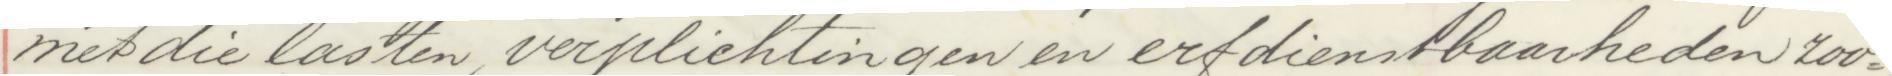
met die lasten, verplichtingen en erfdienstbaarheden zoo„
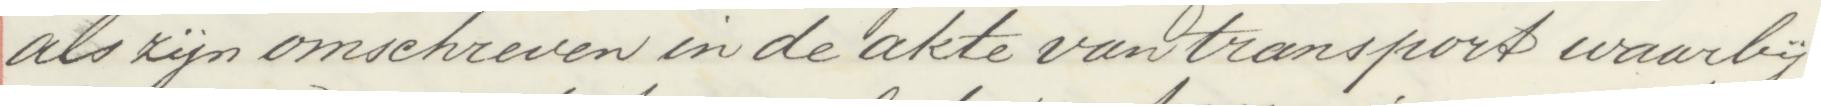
als zijn omschreven in de akte van transport waarbij
